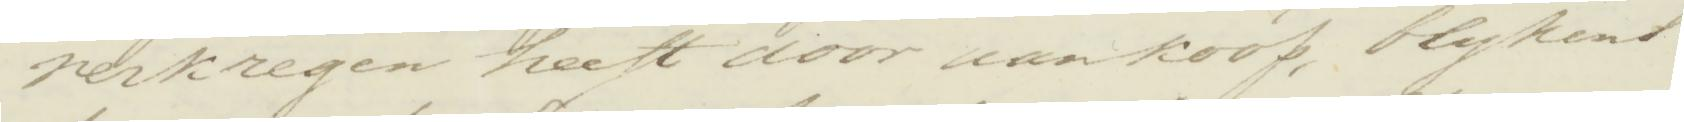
verkregen heeft door aankoop, blykens
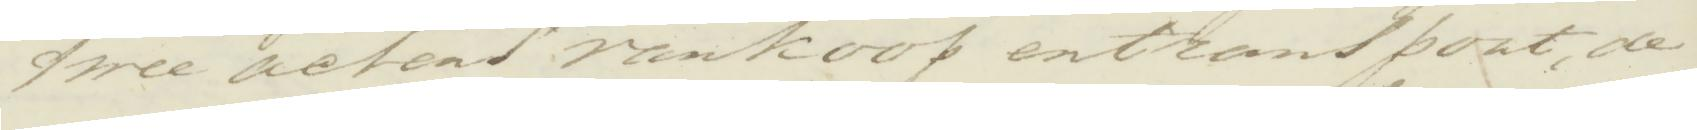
twee actens van koop en transport, de
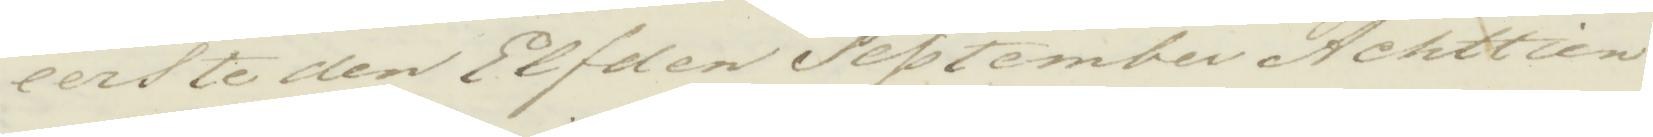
eerste den Elfden September Achttien
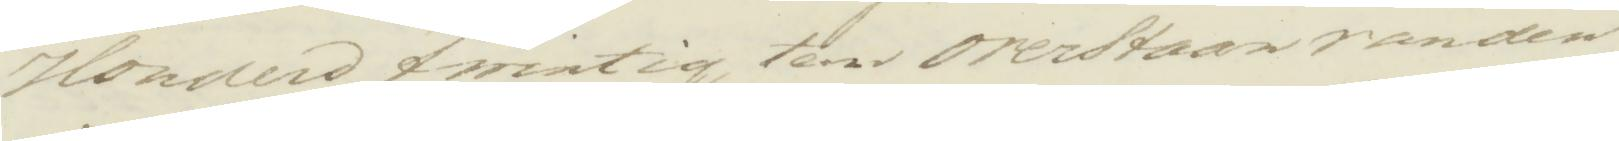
Honderd twintig, ten overstaan van den
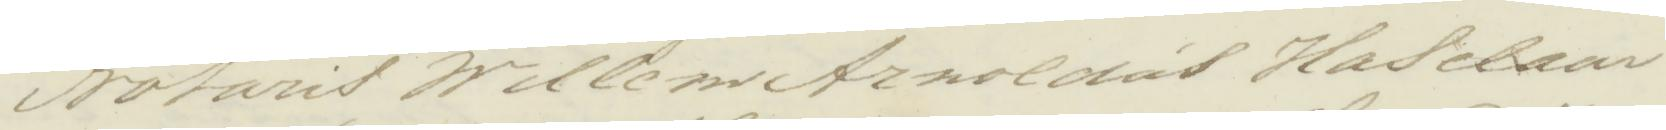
Notaris Willem Arnoldus Haselaar
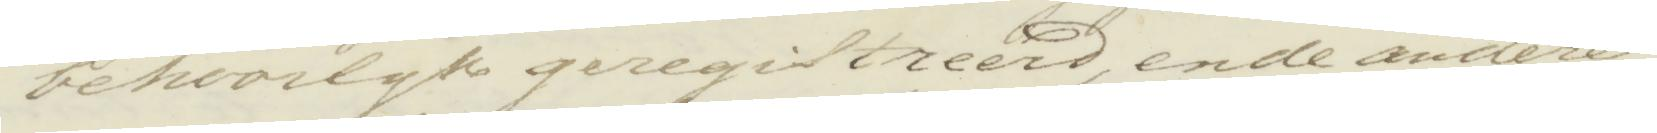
behoorlyk geregistreerd, ende andere
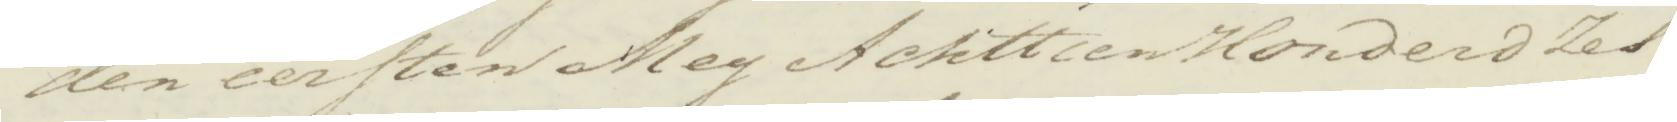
den eersten Mey Achttien Honderd Zes
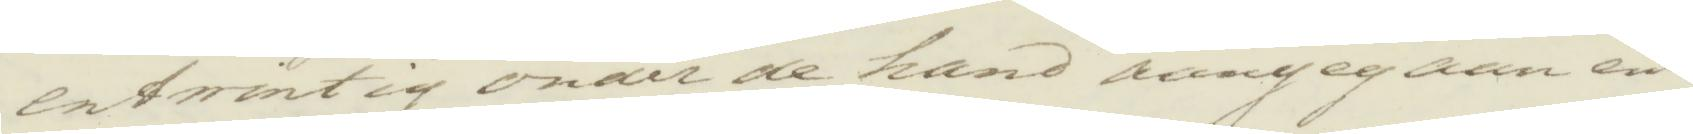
en twintig onder de hand aangegaan en
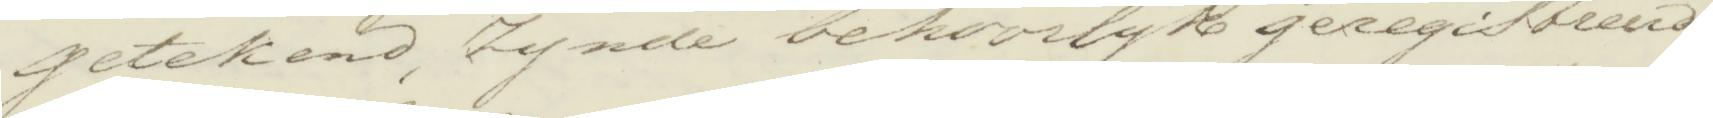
getekend, zynde behoorlyk geregistreerd
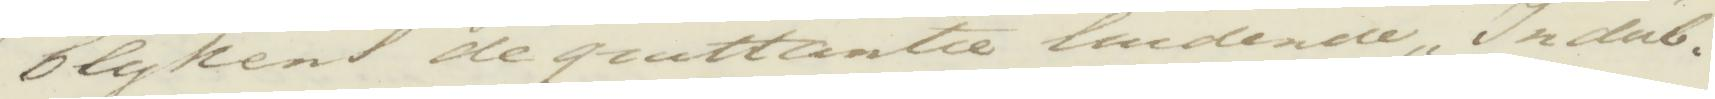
blykens de quittantie luidende,, In dub„
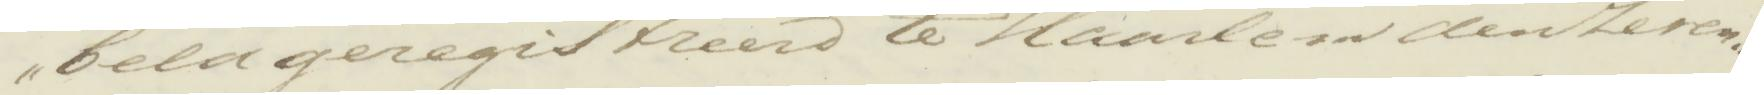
„beld geregistreerd te Haarlem den Zeven„
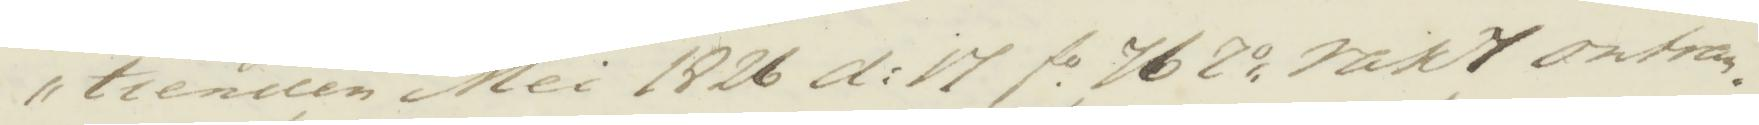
„tienden Mei 1826 d: 17 f.o 76 r„.o vak 7 ontvan„
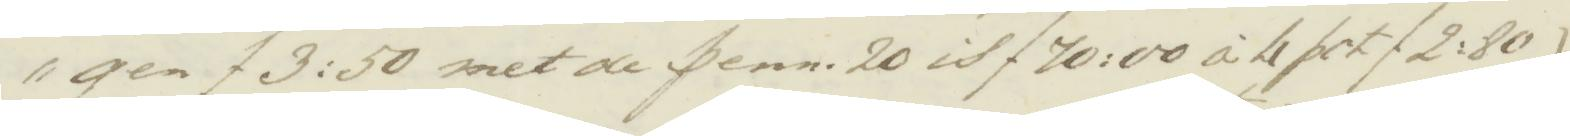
„gen ƒ3: 50 met de penn. 20 is ƒ 70:00 â 4 pct ƒ 2:80
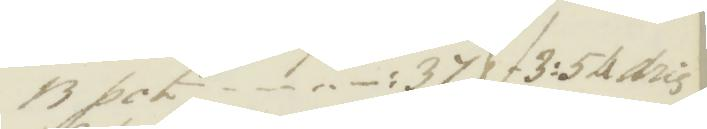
13 pct - - - „ —: 37 ƒ3:54 drie
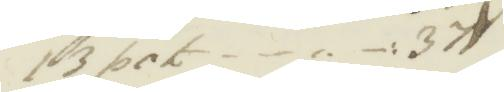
13 pct - - - „ —: 37
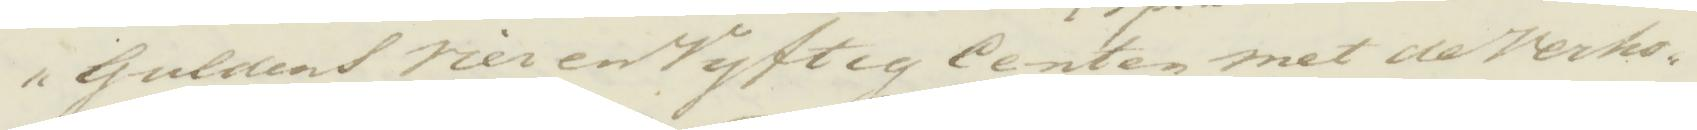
„ Guldens vier en Vyftig Centen met de verho„
